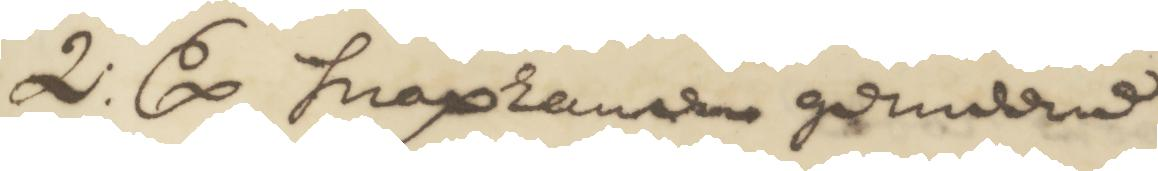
2: Ex„ snaphanen gemeene
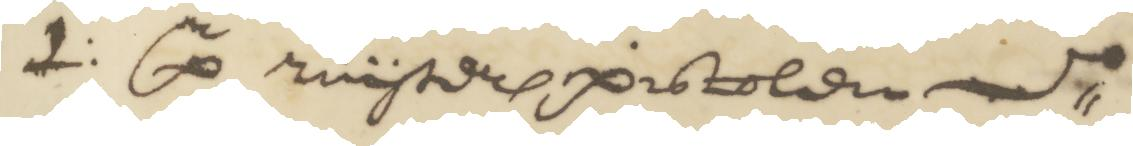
1: Ex„ ruijter pistolen _„o
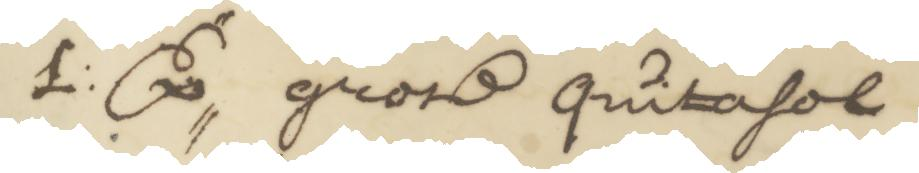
1: Ex„ grote quitasel
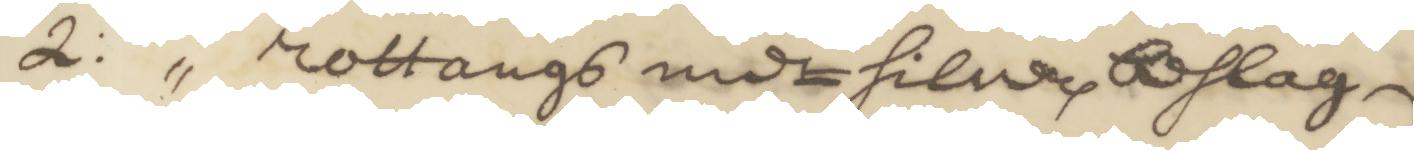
2: „ rottangs met silver beslag,
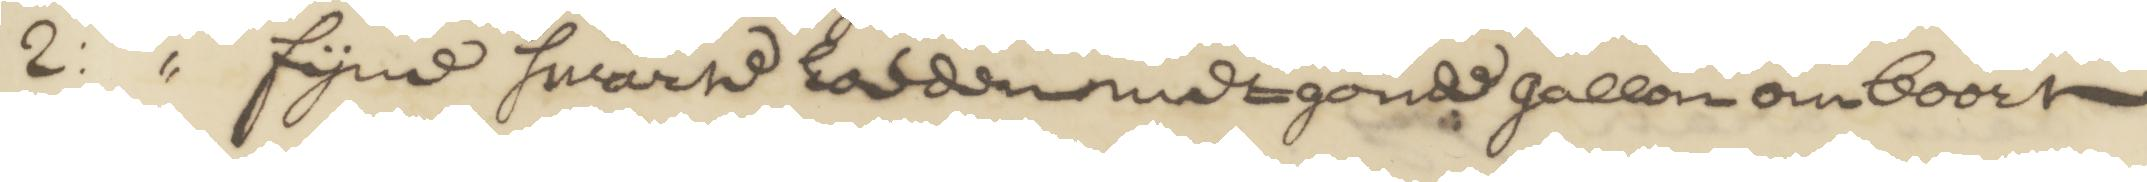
2: „ fijne swarte hoeden met goude gallon omboort
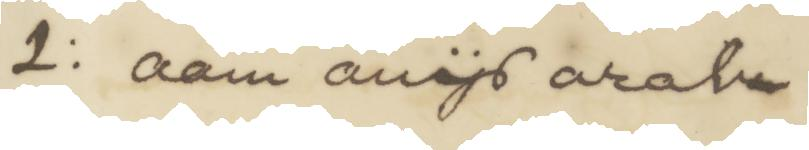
1: aam anijs arak
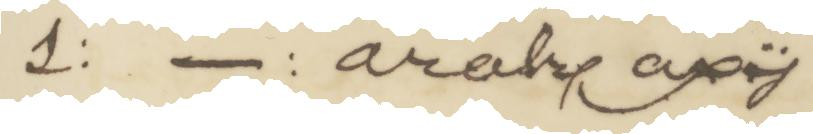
1: — arak apij
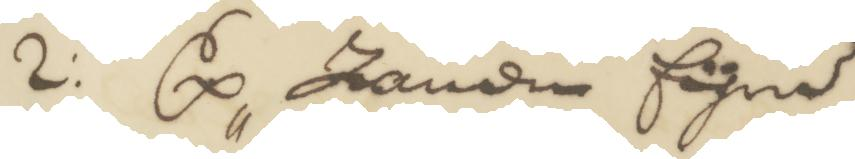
2: Ex„ zanen fijne
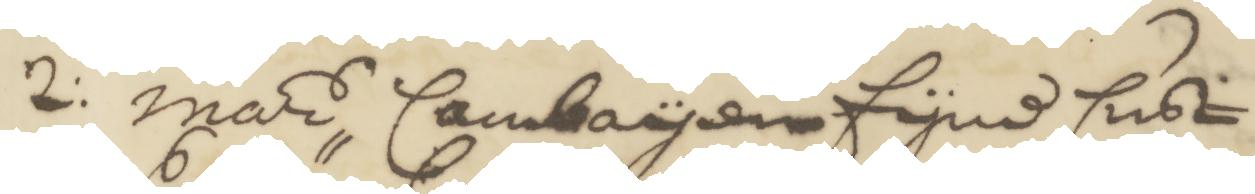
2: mar„s cambaijen fijne Cust
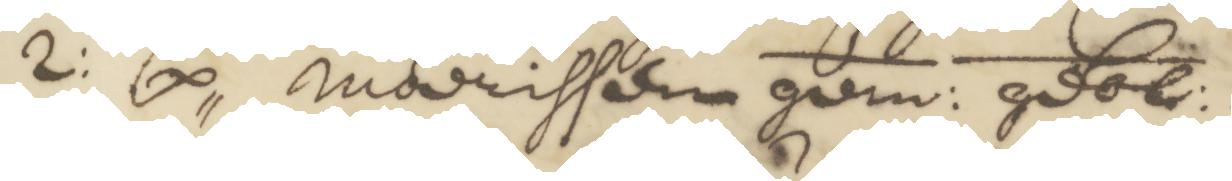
2: Ex„ moerissen gem: gebl:
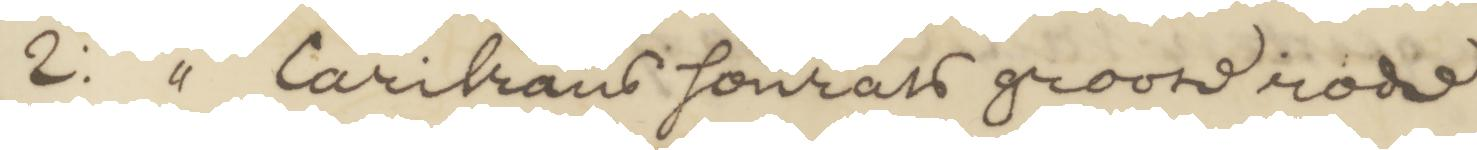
2: „ carikans sourats groote rode
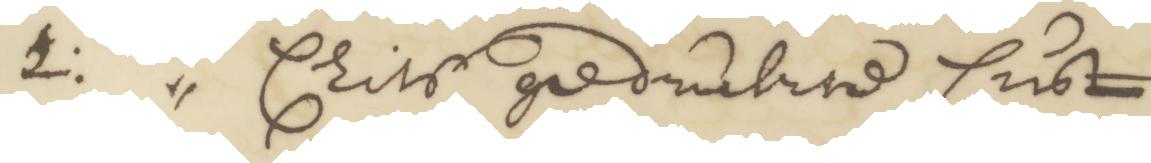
2: „ Chits gedrukte Cust
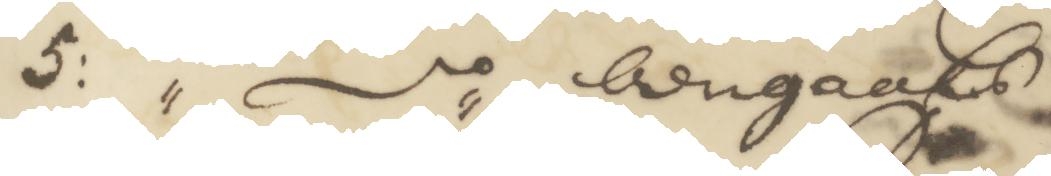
5: „ _„o bengaals
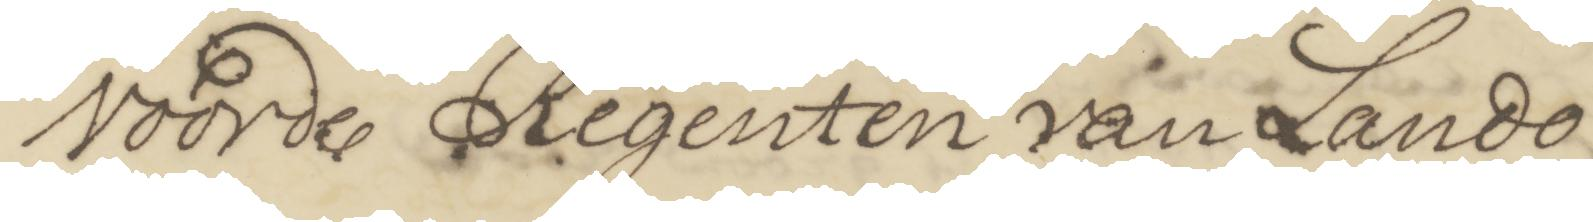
voorde Regenten van Lando
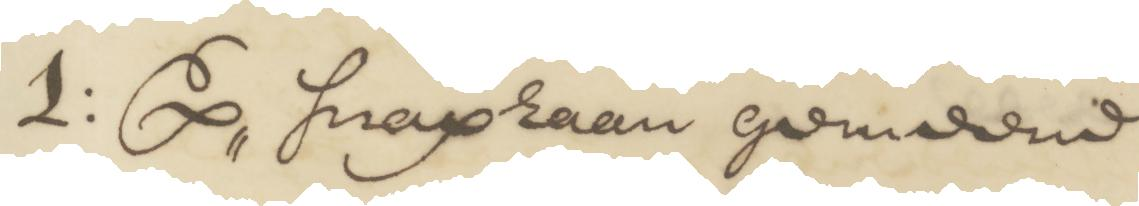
1: Ex„ snaphaan gemeene
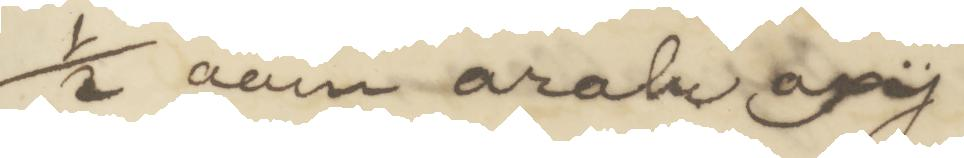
½ aam arak apij
